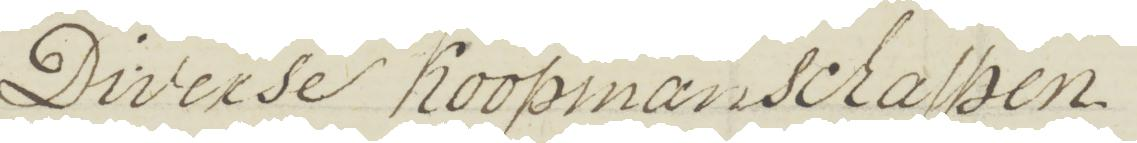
Diverse koopmanschappen
